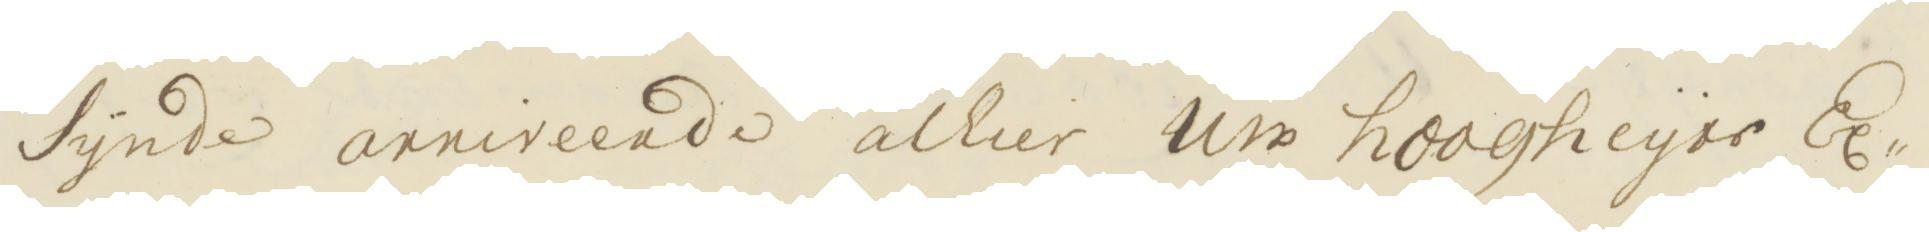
sijnde arriveerde alhier uw hoogheijts Ex„
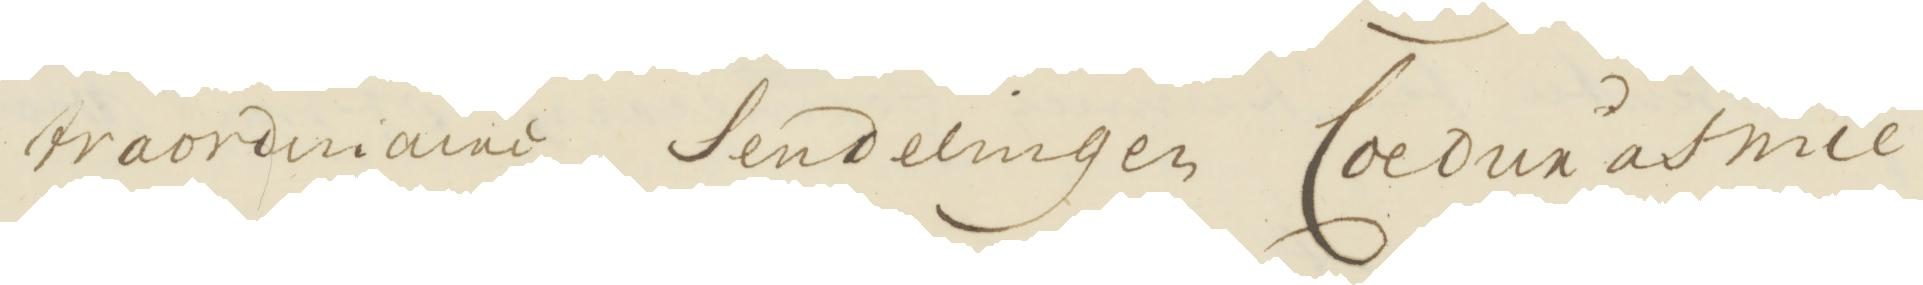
traordinaire sendelingen Coedur asmie
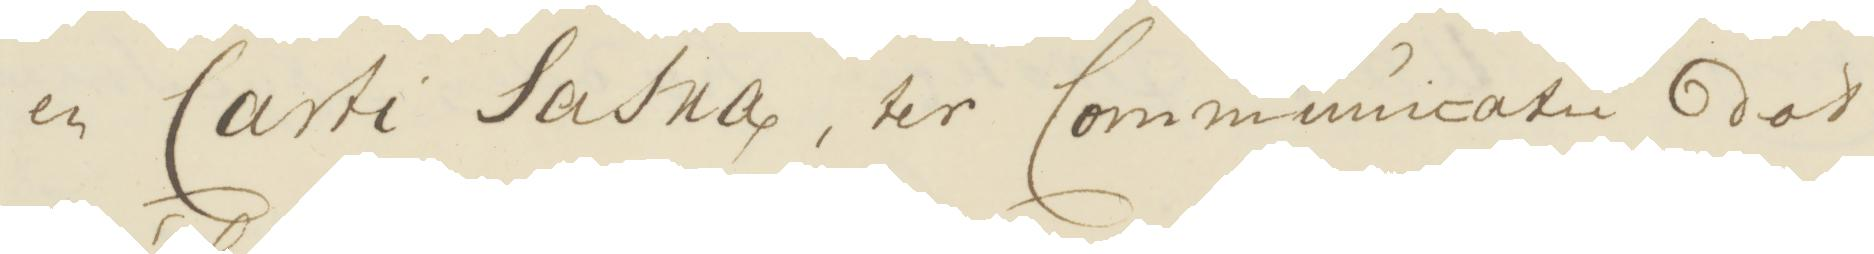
en Carti sasra, ter Communicatie dat
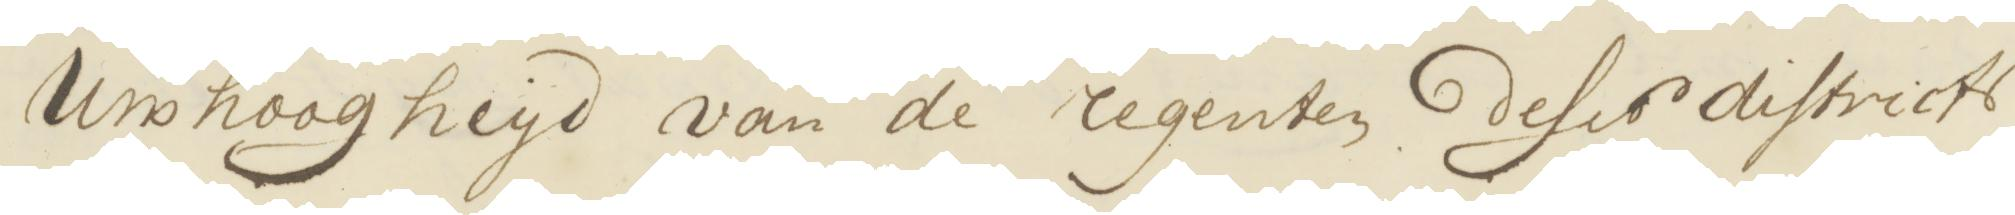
uw hoogheijd van de regenten deses districts
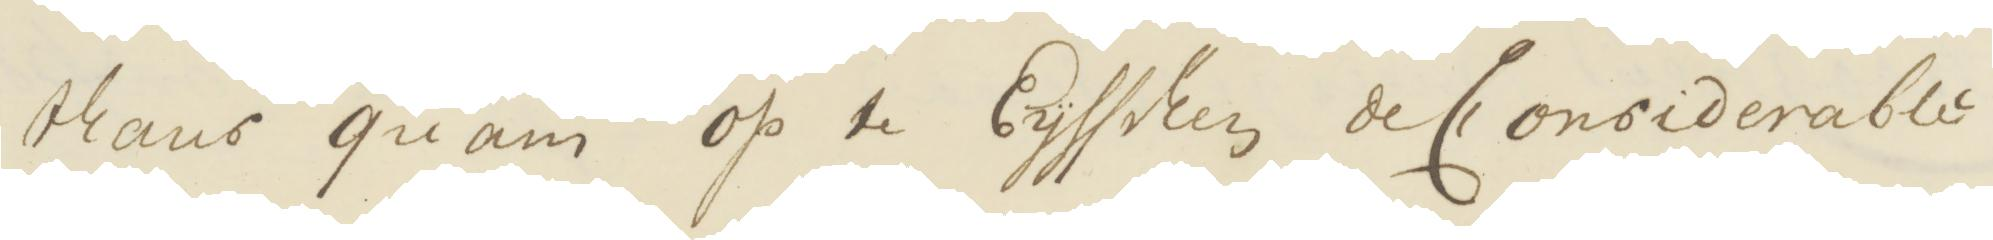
thans quam op te Eijsschen de Considerable
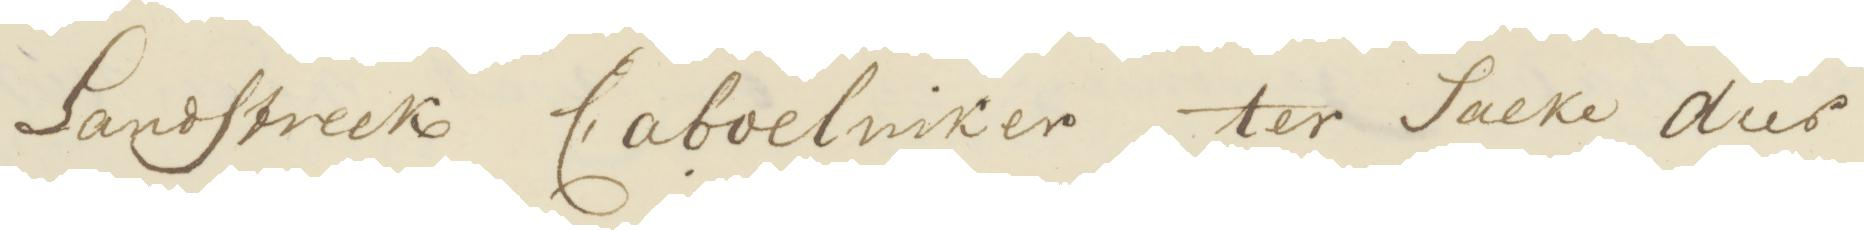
Landstreek Caboelniker ter saeke dies
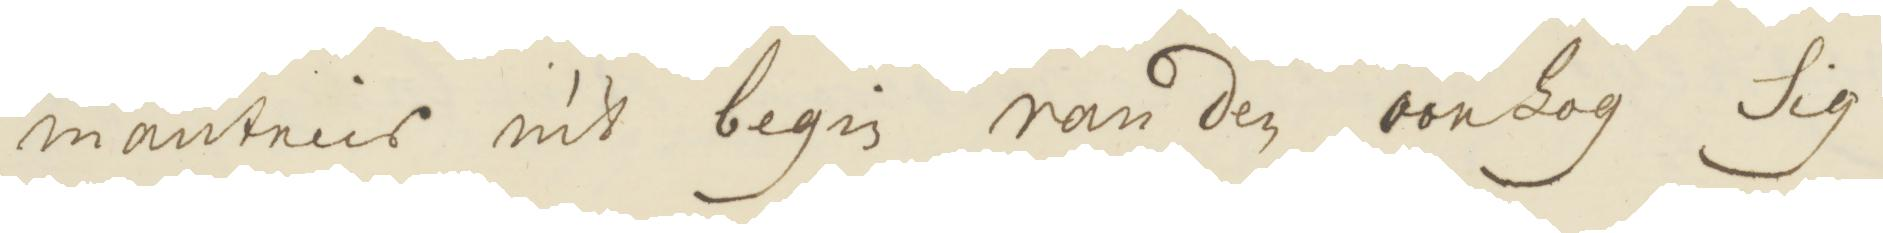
mantries in't begin van den oorlog sig
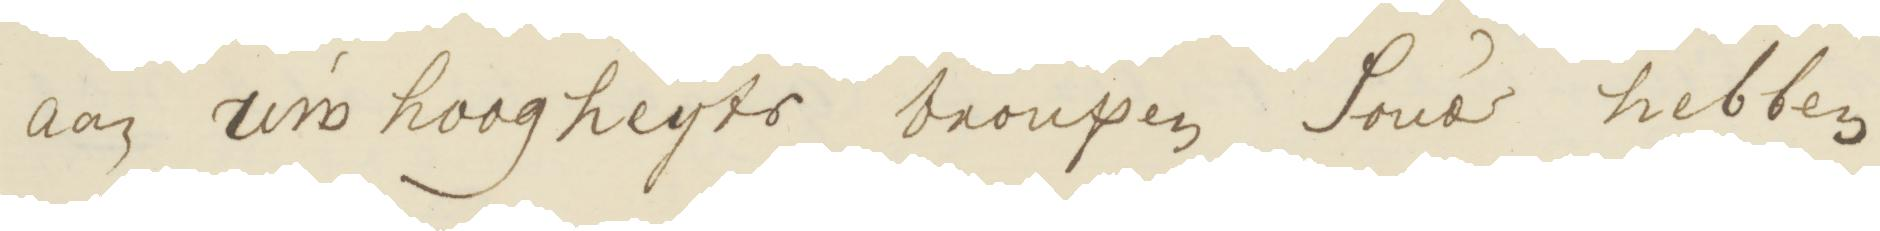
aan uw hoogheijts troupen soude hebben
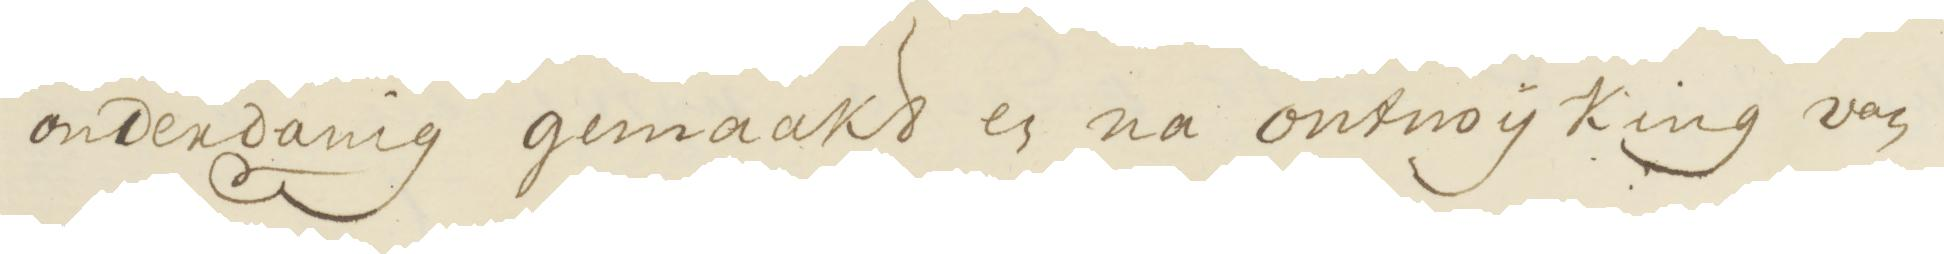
onderdanig gemaakt en na ontwijking van
